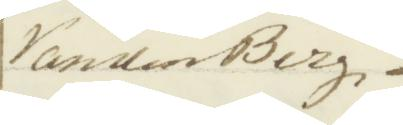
Van den Berg
